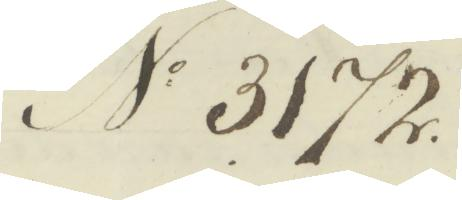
N:o 3172.
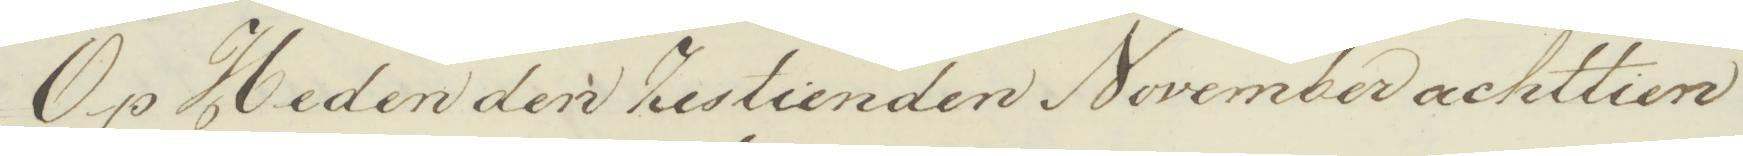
Op Heden den Zestienden November achttien
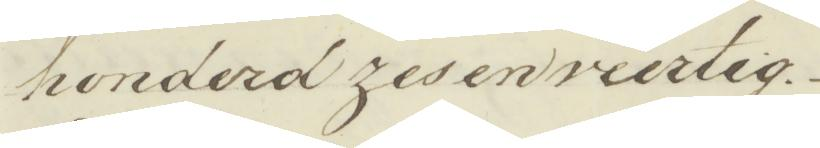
honderd zes en veertig.
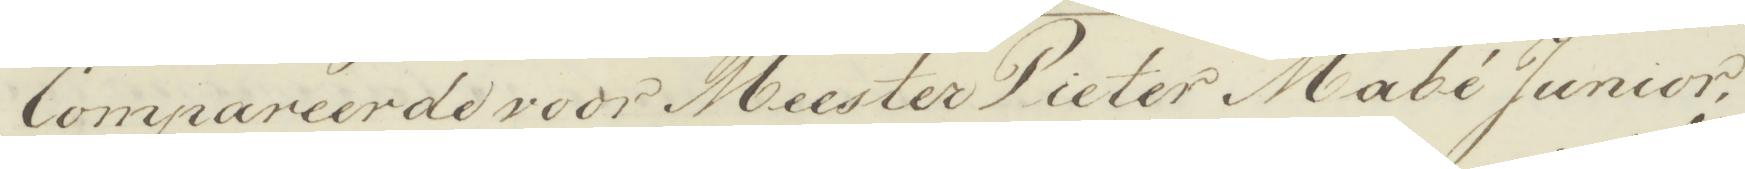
Compareerde voor Meester Pieter Mabé Junior,
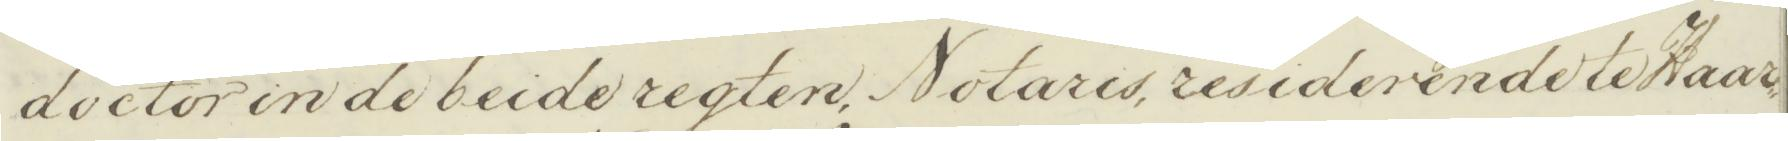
doctor in de beide regten, Notaris, residerende te Haar„
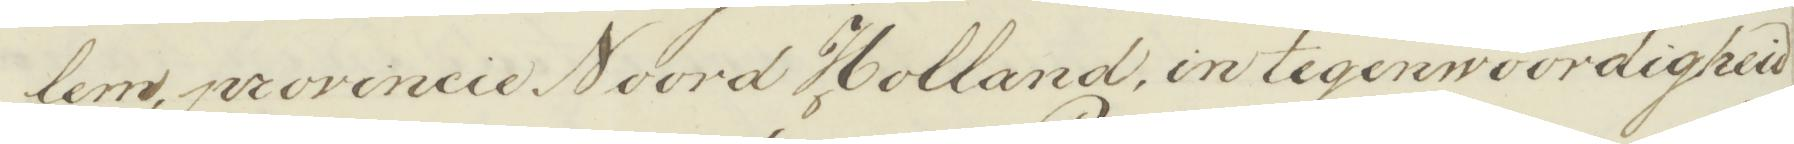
lem, provincie Noord Holland, in tegenwoordigheid
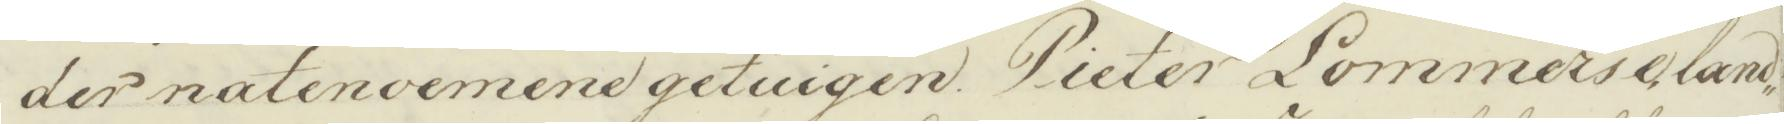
der natenoemene getuigen. Pieter Lommerse, land„
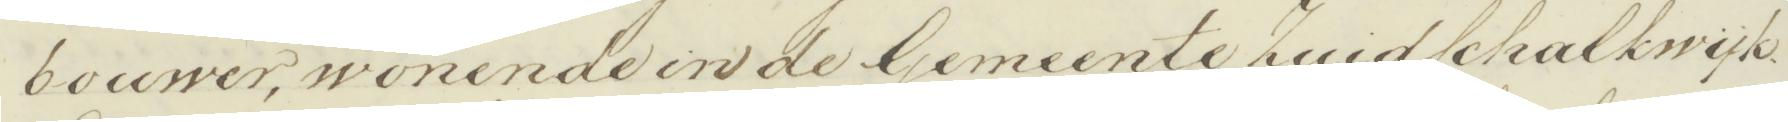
bouwer, wonende in de Gemeente Zuid Schalkwijk.
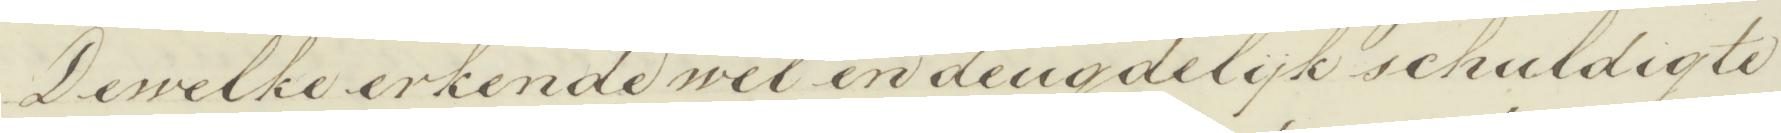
Dewelke erkende wel en deugdelijk schuldig te
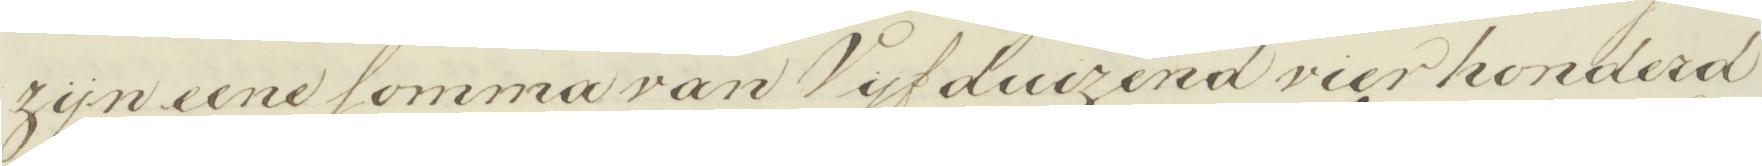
zijn eene somma van Vijf duizend vier honderd
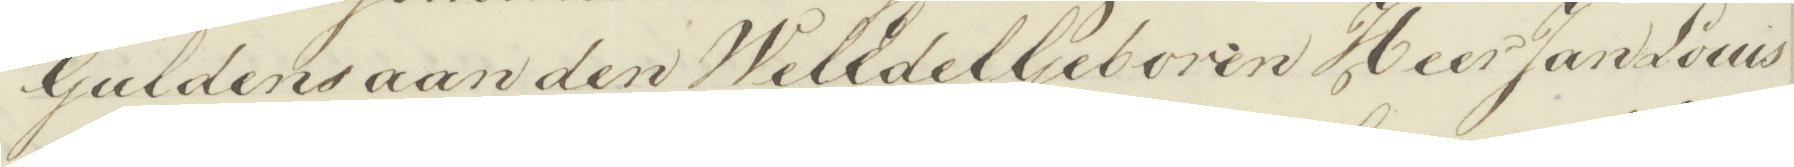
Guldens aan den WelEdel Geboren Heer Jan Louis
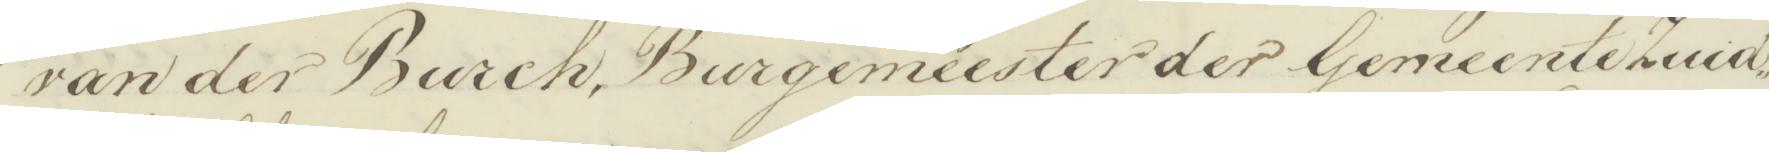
van der Burch, Burgemeester der Gemeente Zuid„
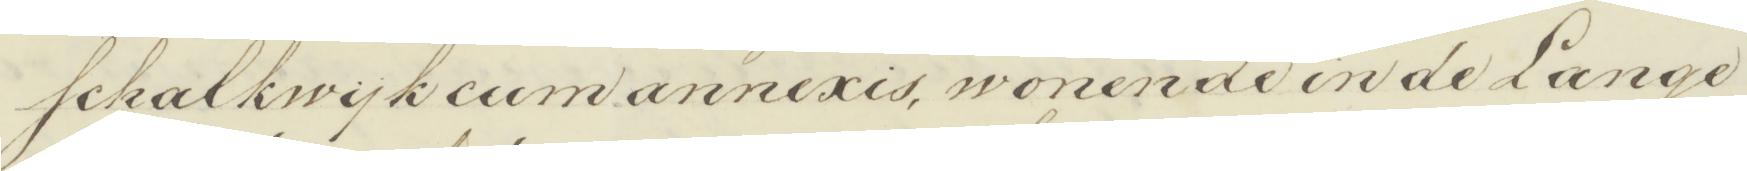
Schalkwijk cum annexis, wonende in de Lange
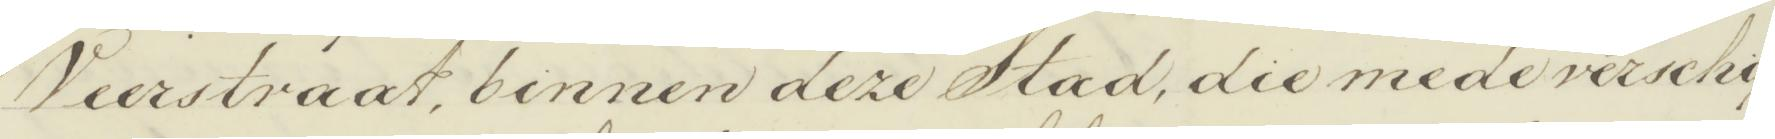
Veerstraat, binnen deze Stad, die mede verschij
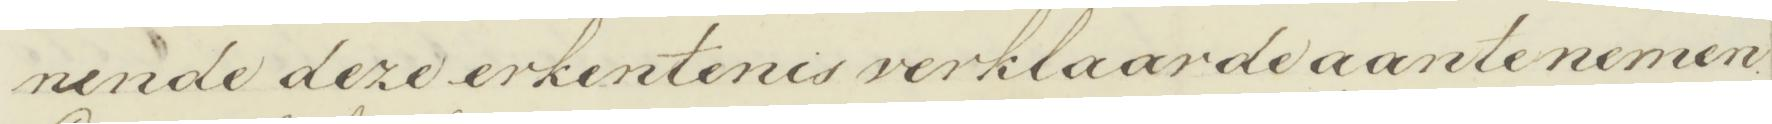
nende deze erkentenis verklaarde aan te nemen.
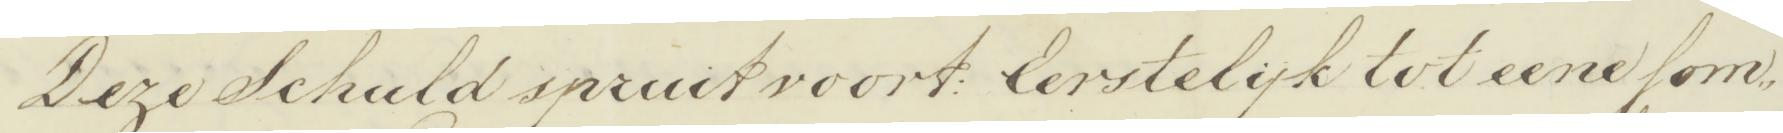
Deze Schuld spruit voort: Eerstelijk tot eene Som„
